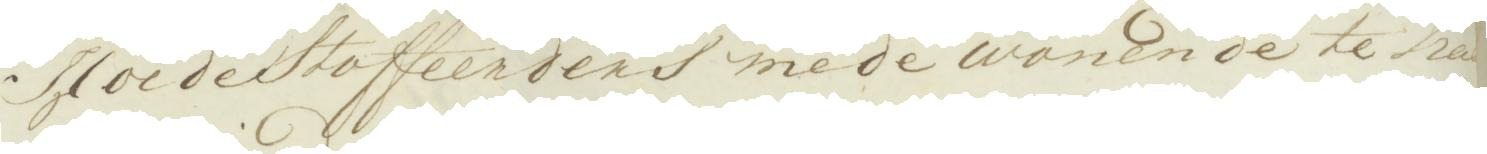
Hoedestoffeerders mede wonende te ha
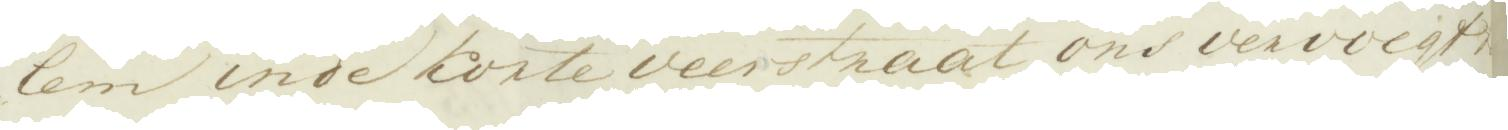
lem in de korte veerstraat, ons vervoegt
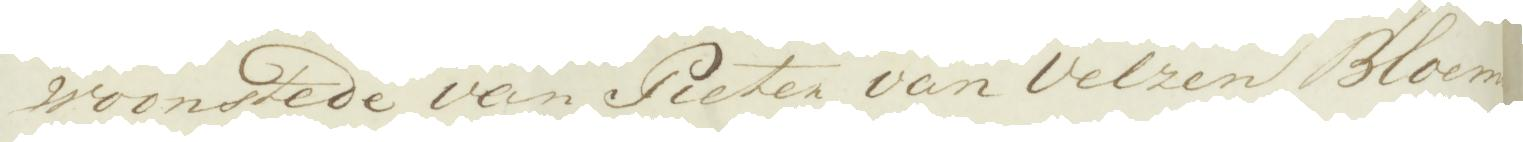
woonstede van Pieter van Velzen, Bloem
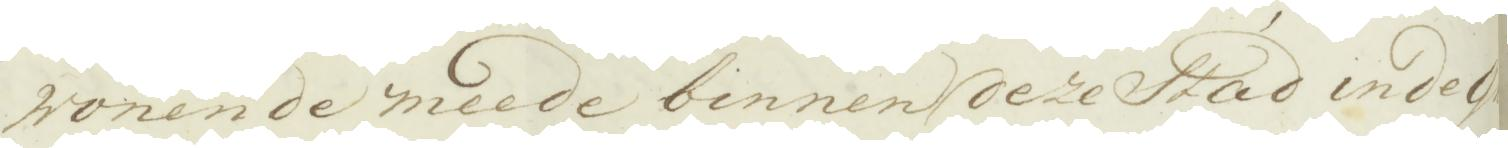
wonende meede binnen deze Stad in de g
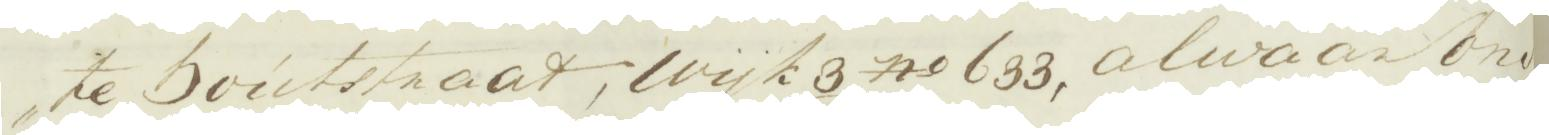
„te houtstraat, wijk 3 n=o 633, alwaar ons
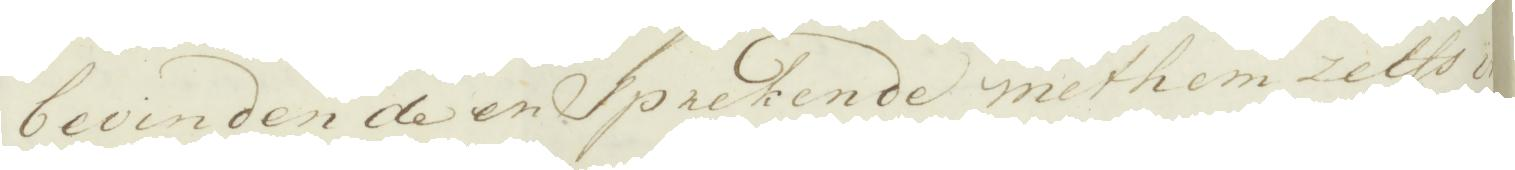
bevinden de en Sprekende methem zelfs i
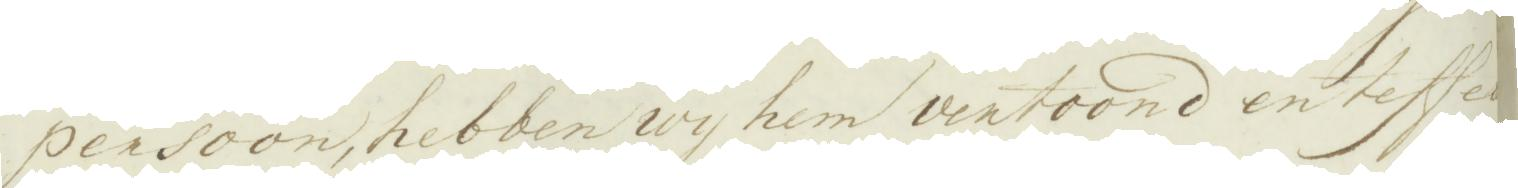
persoon, hebben wy hem vertoond en teffe
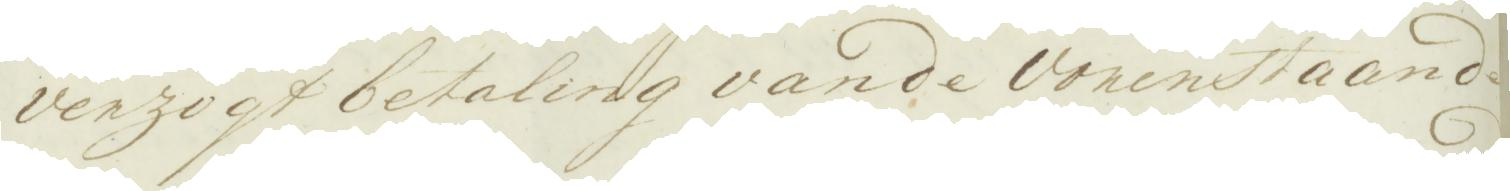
verzogt betaling van de vorenstaande
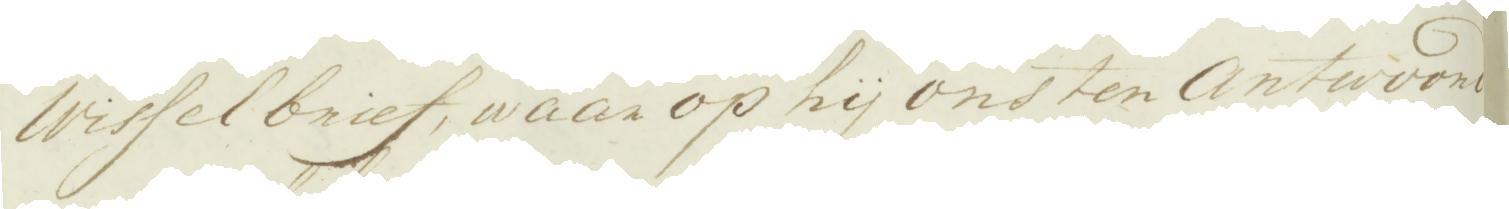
Wisselbrief, waar op hij ons ten Antwoord
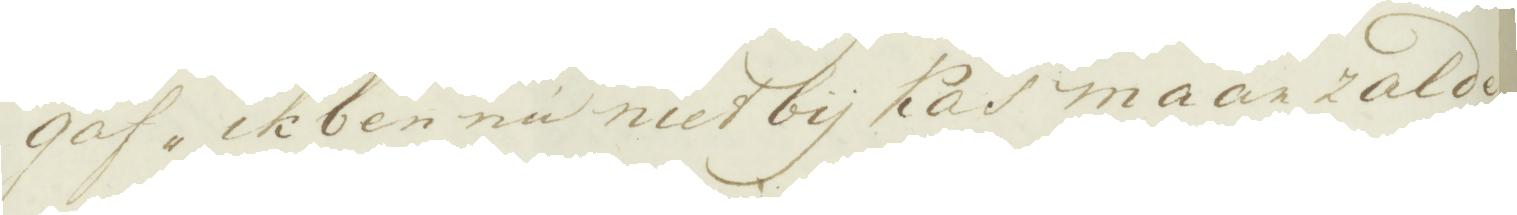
gaf, ik ben nu niet bij kas maar zal de
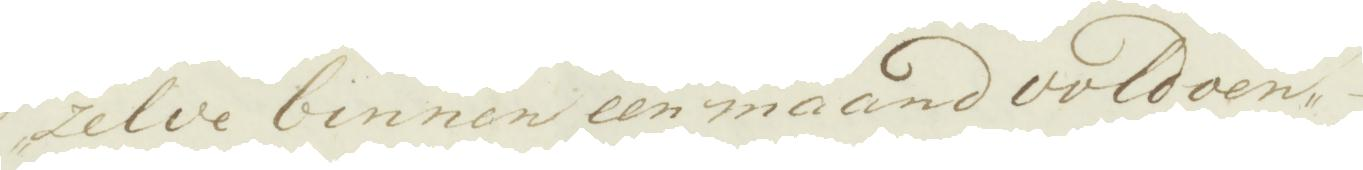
„zelve binnen een maand voldoen„
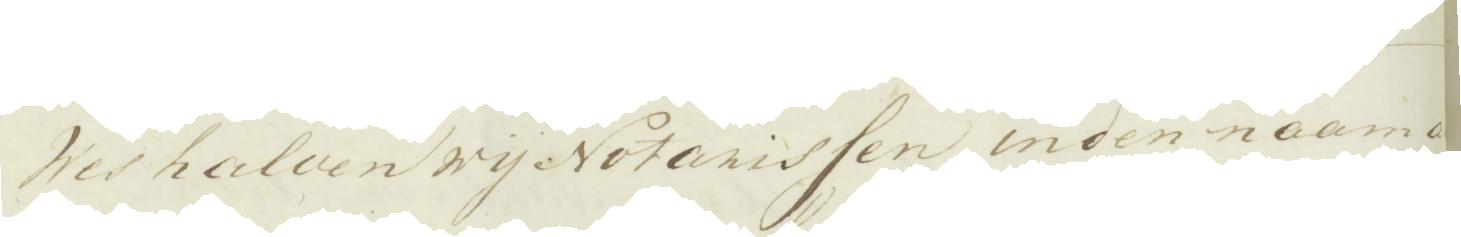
Weshalven wij Notarissen in den naame
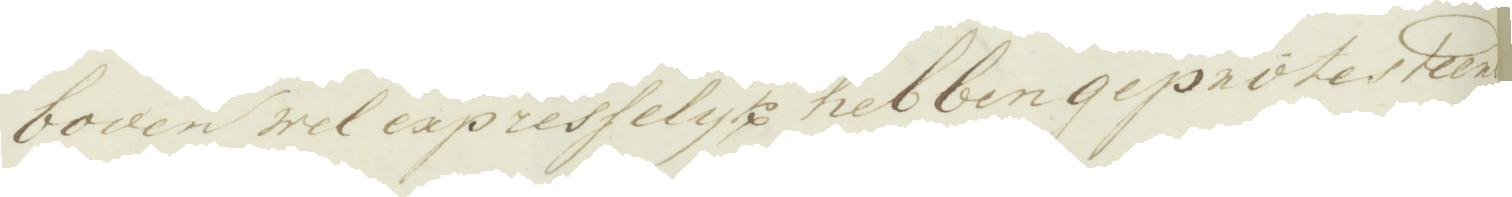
boven wel expresselyk hebben geprotesteer
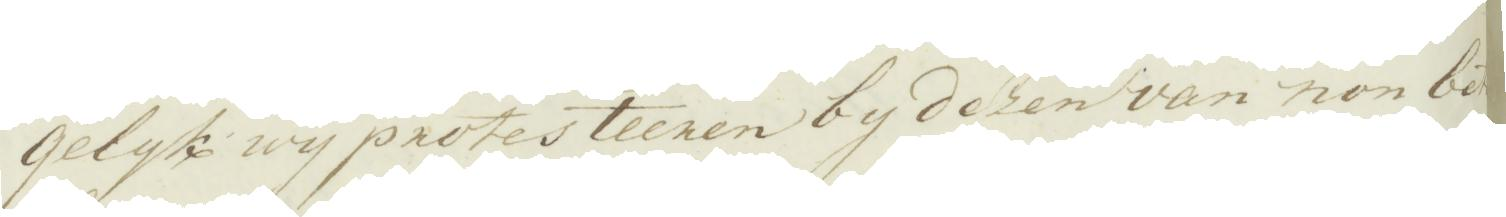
gelyk wy protesteeren by dezen van non be
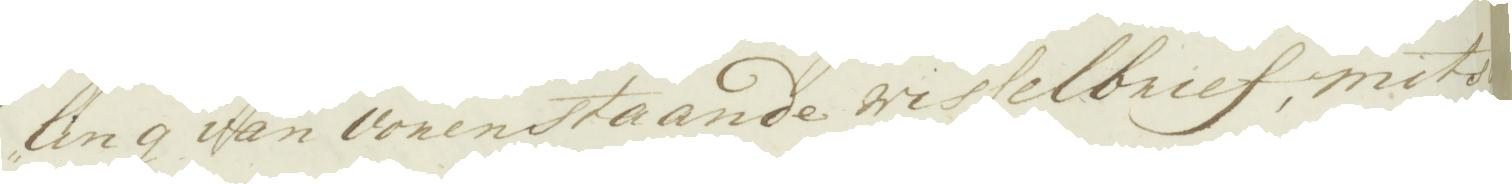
„ling van vorenstaande wisselbrief, mits
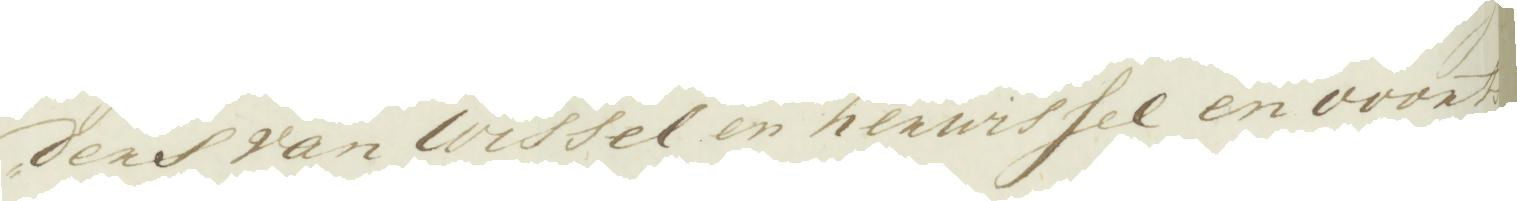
„ders van wissel en herwissel en voorts
